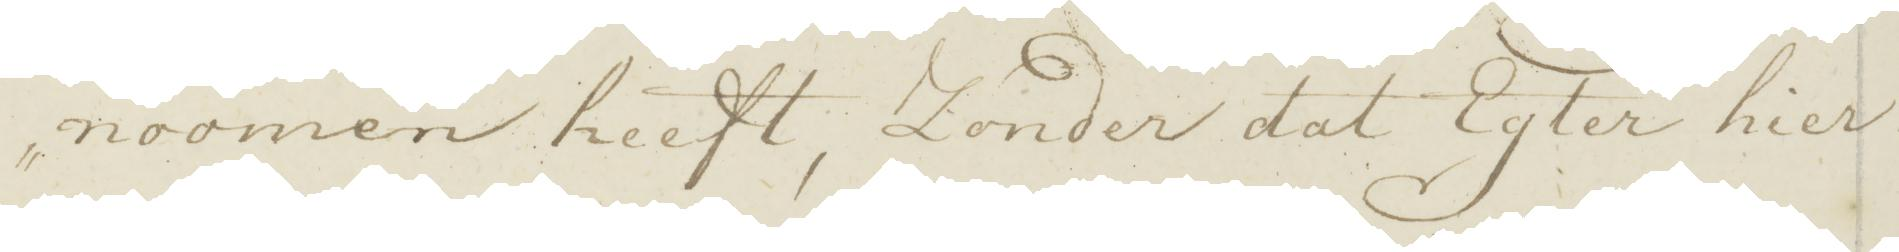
„noomen heeft; zonder dat Egter hier
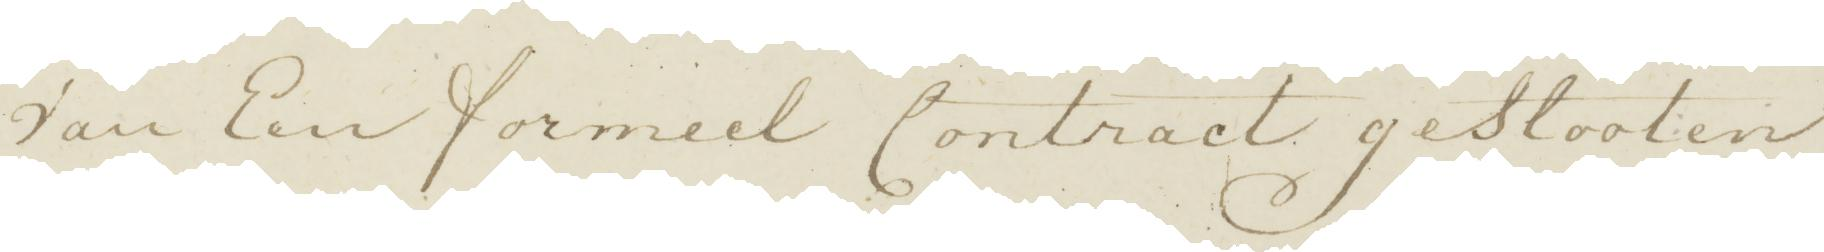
van Een formeel contract geslooten
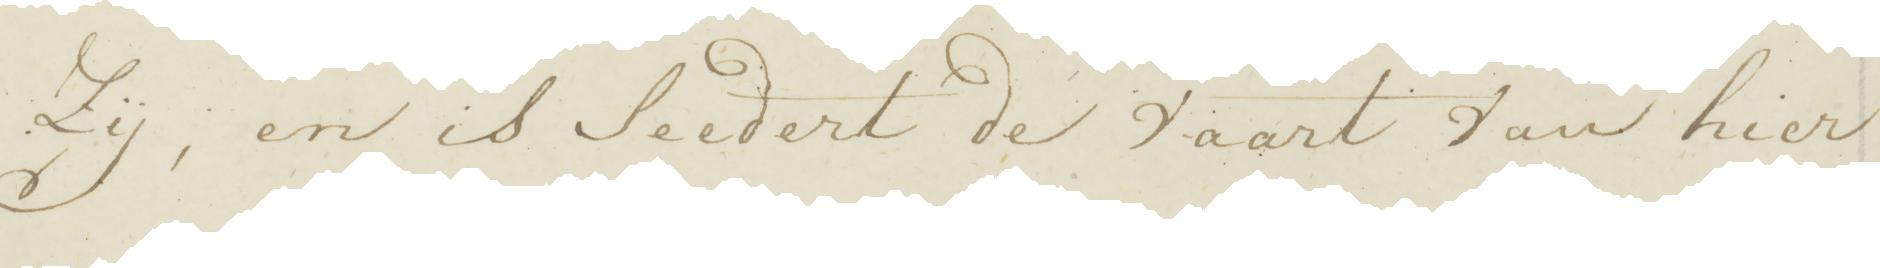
zij, en is seedert de vaart van hier
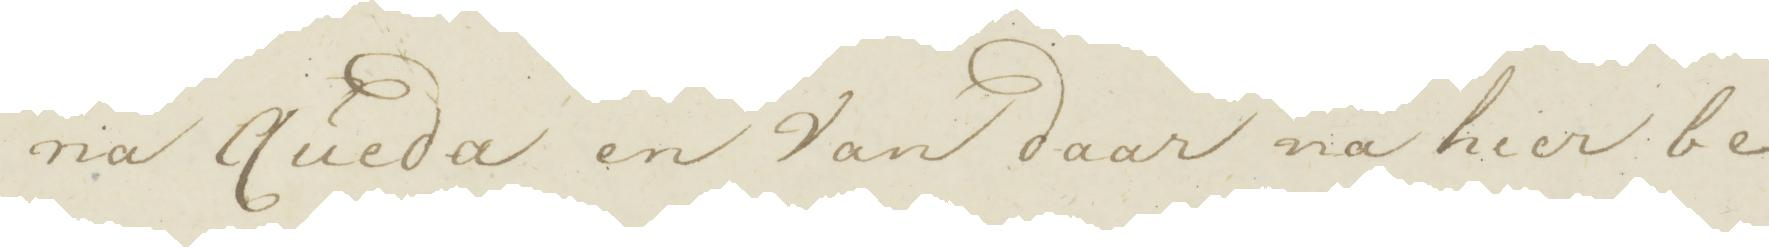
na Queda en van daar na hier be
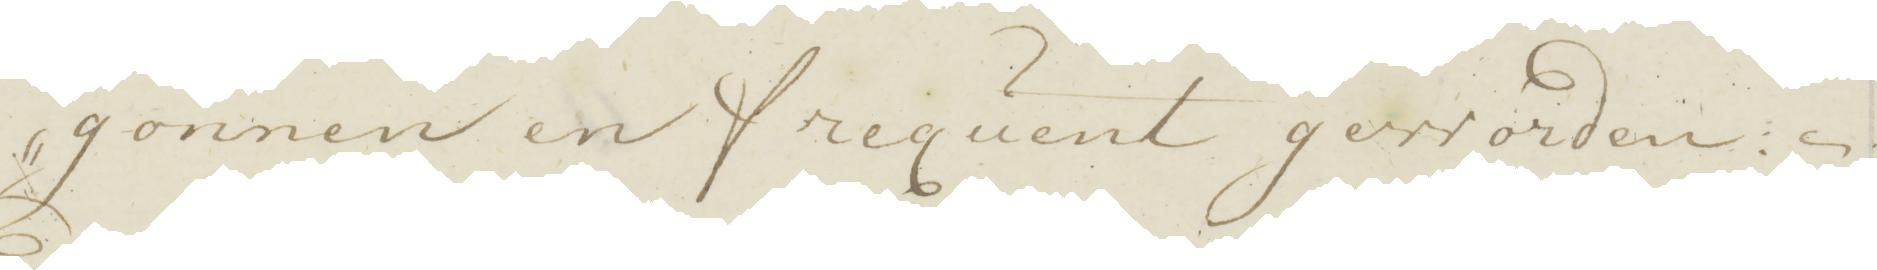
„gonnen en frequent geworden:
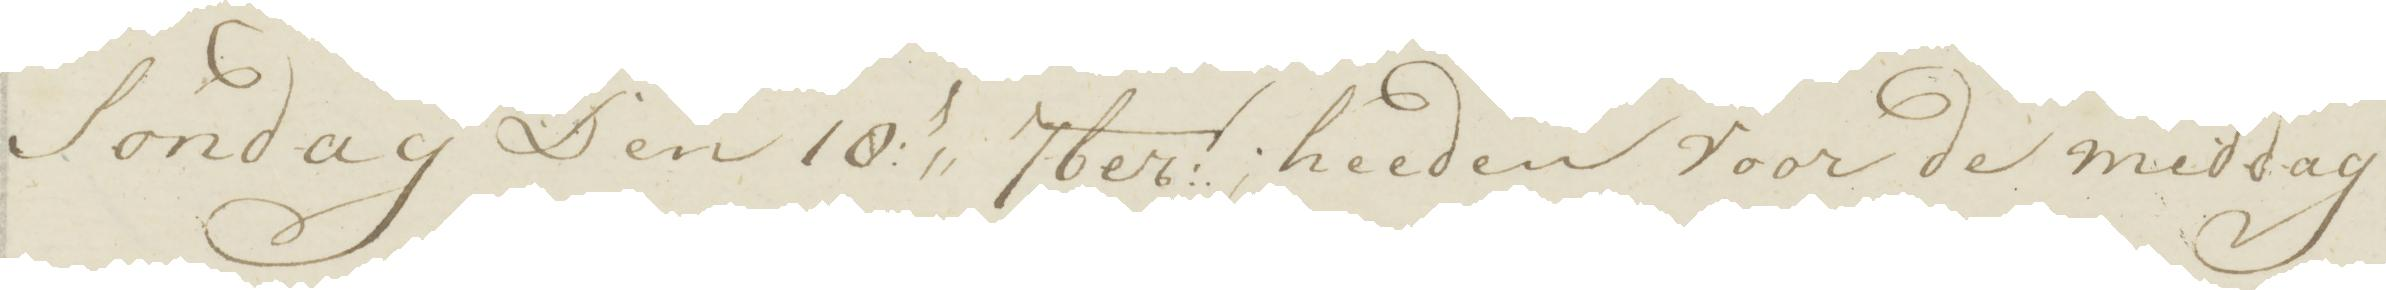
Sondag Den 18:„e 7ber; heeden voor de middag
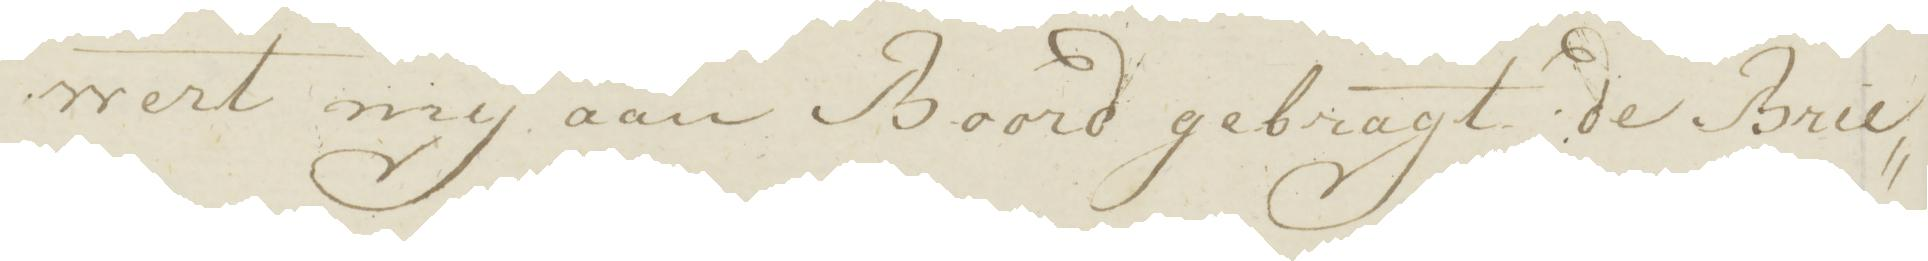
wert mij aan Boord gebragt de Brie„
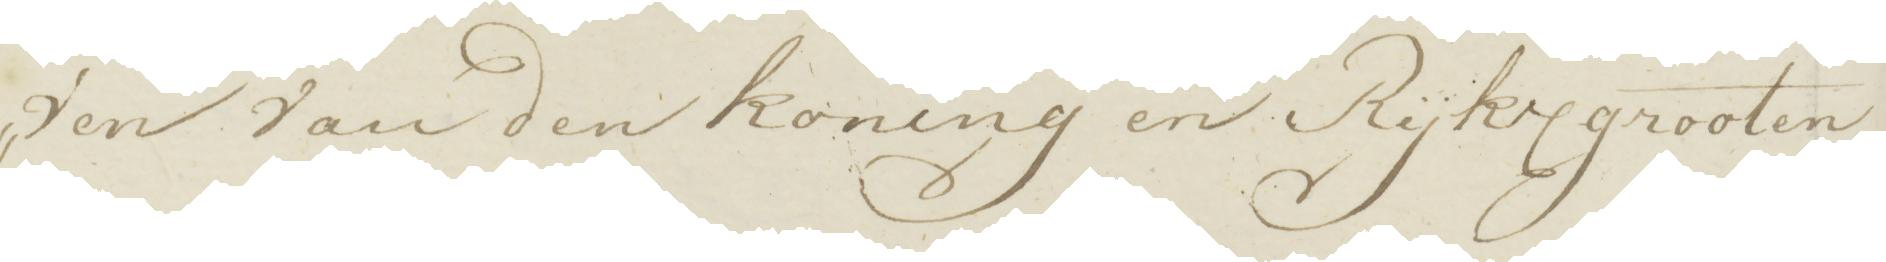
„ven van den koning en Rijkxgrooten
